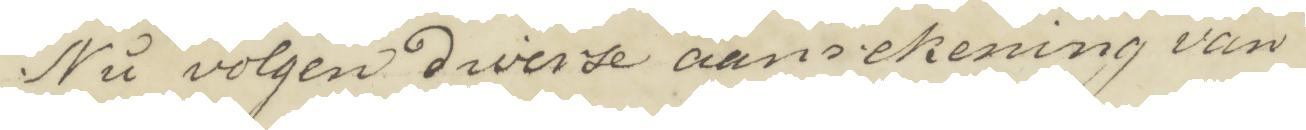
Nu volgen diverse aan rekening van
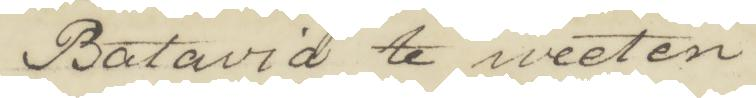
Batavia te weeten
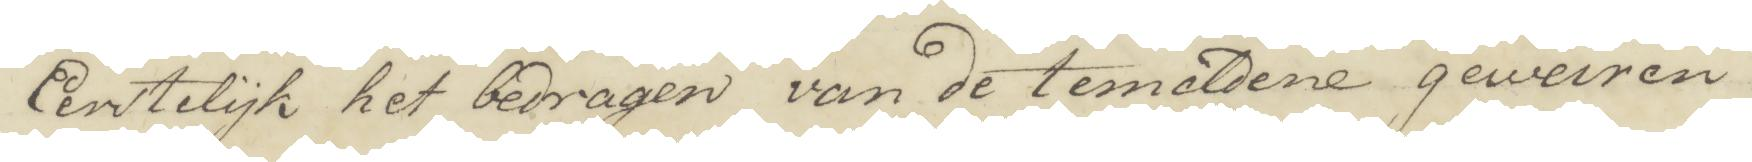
Eerstelijk het bedragen van de temeldene geweiren
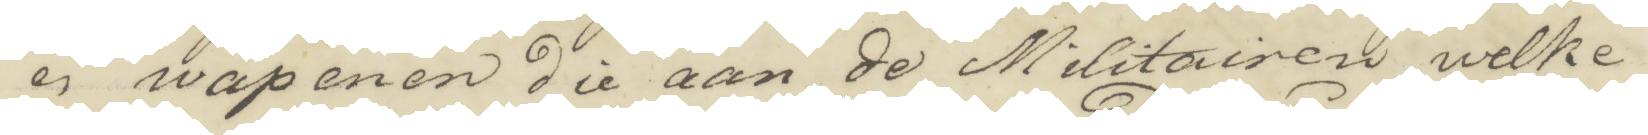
en wapenen die aan de Militairen welke
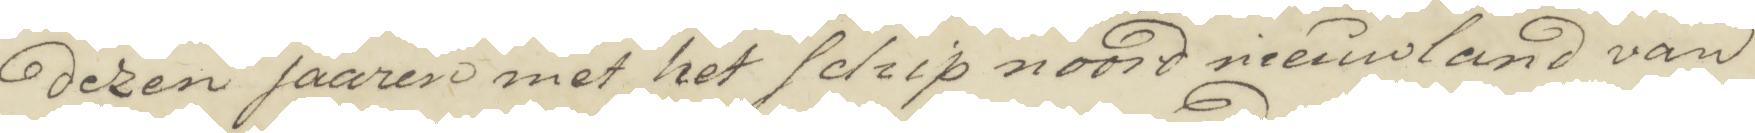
dezen jaaren met het schip noord nieuwland van
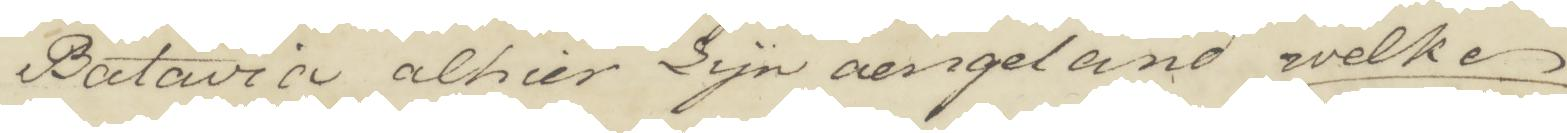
Batavia alhier zijn aengeland welke
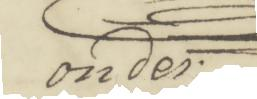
on der
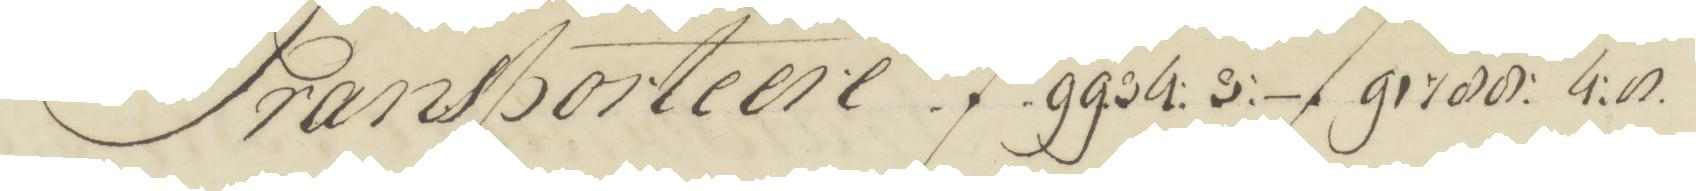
Transporteere ƒ 99.34: 3:— ƒ 91788: 4:8.
